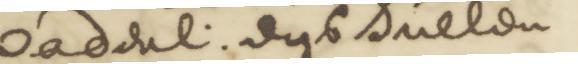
vaderl: eys Sullen
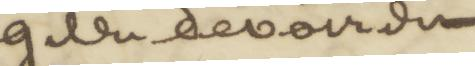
geen devoiren
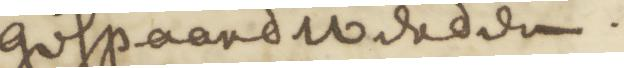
gespaard werden.
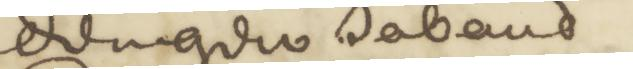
den gew: saband:r
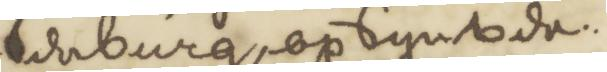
terburg, op sijnver„
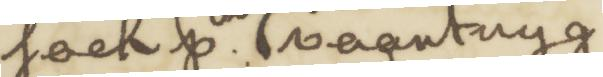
soek p:r 't vaartuijg
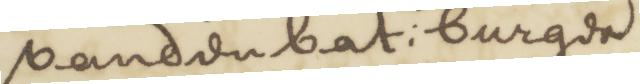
vanden bat:s burger
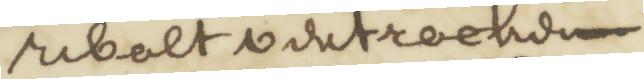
ribalt vertrocken,
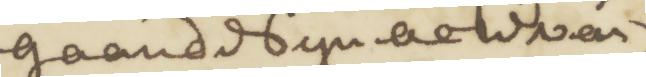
gaande sijn actevan
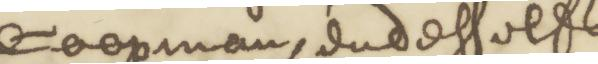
Coopman, endesselfs
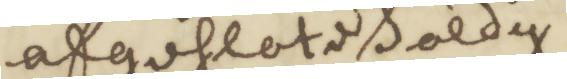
afgeslote Soldij
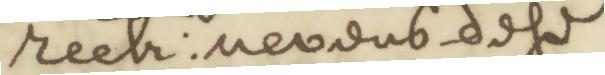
reek: nevens dese
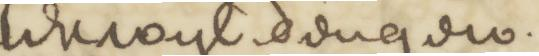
terwijl dengew.
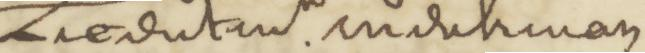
Licentm.r merkman
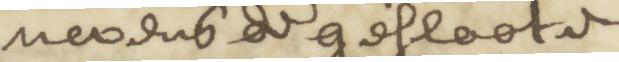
nevens de gesloote
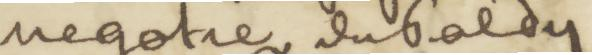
negotie, ensoldij
